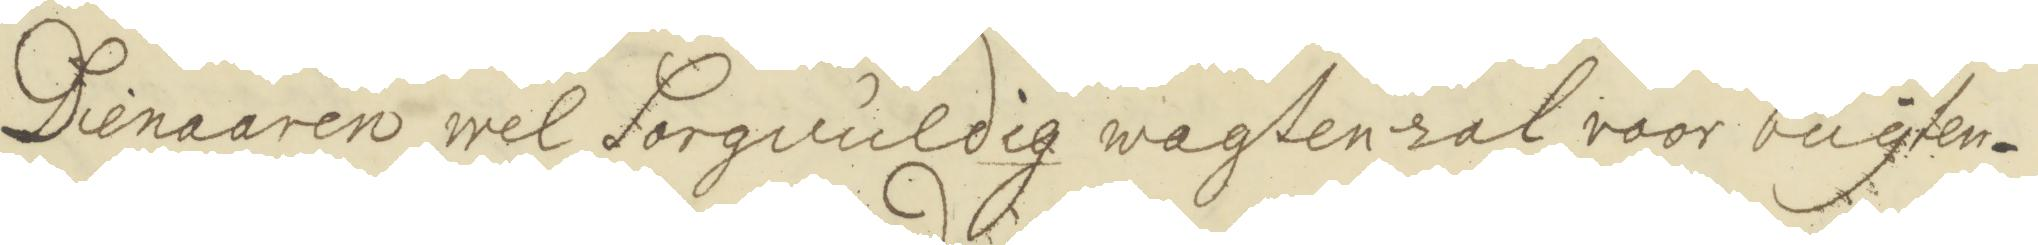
Dienaaren wel sorgvuldig wagten zal voor buijten-
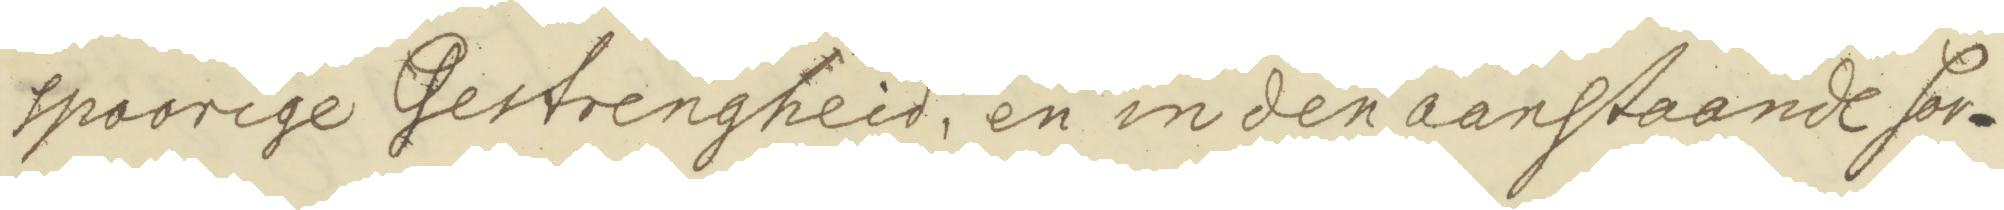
spoorige Gestrengheid, en in den aanstaande sor-
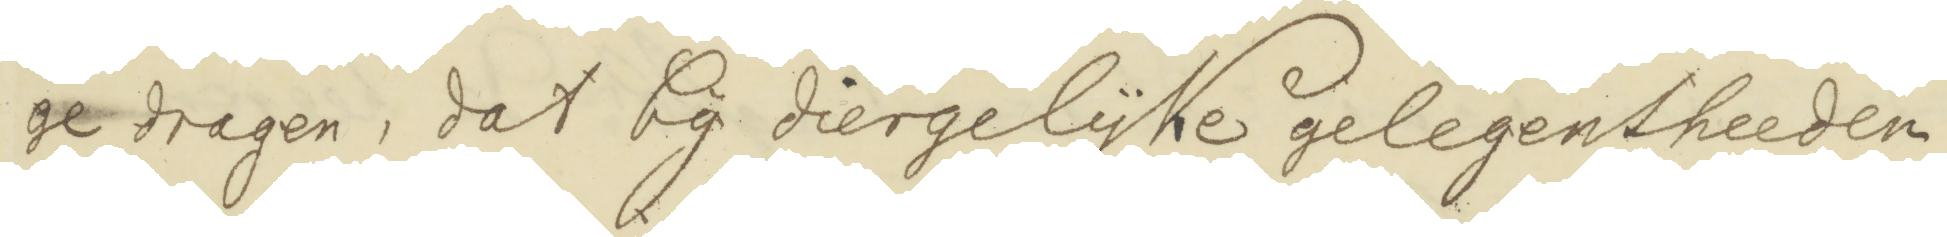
ge dragen, dat bij diergelijke gelegentheeden
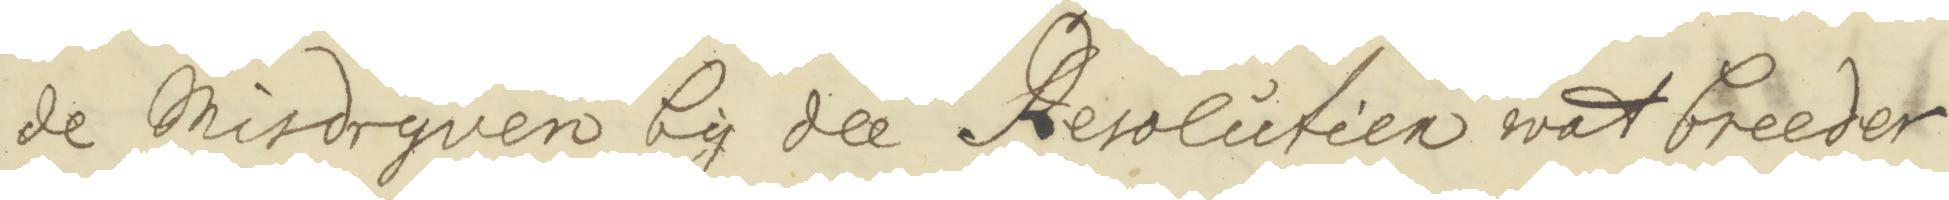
de misdrijven bij de Resolutien wat breeder
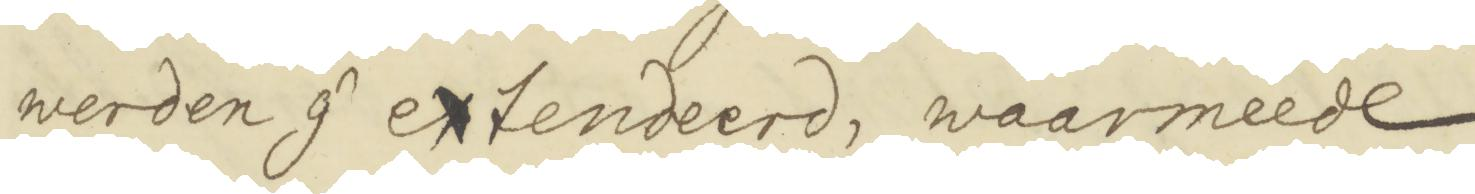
werden g’ extendeerd, waarmeede
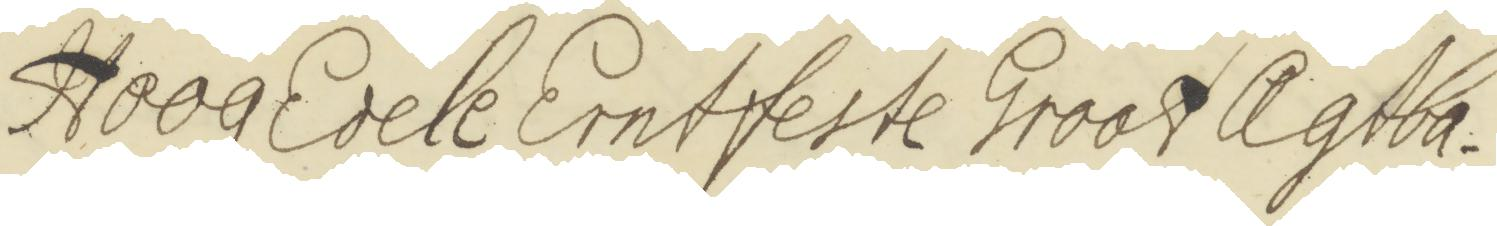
Hoog Edele Erntfeste Groot Agtba-
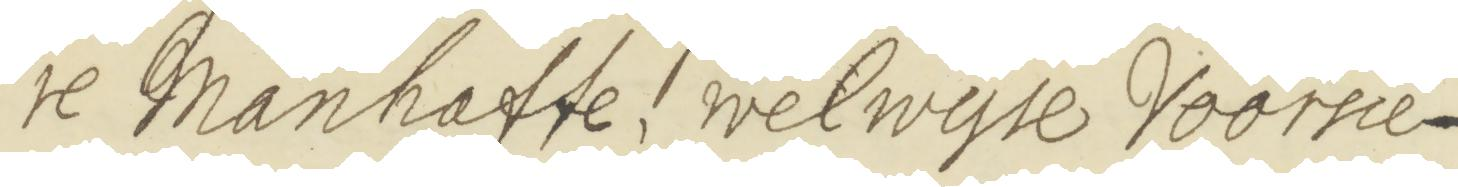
re Manhafte, wel wijse Voorsie-
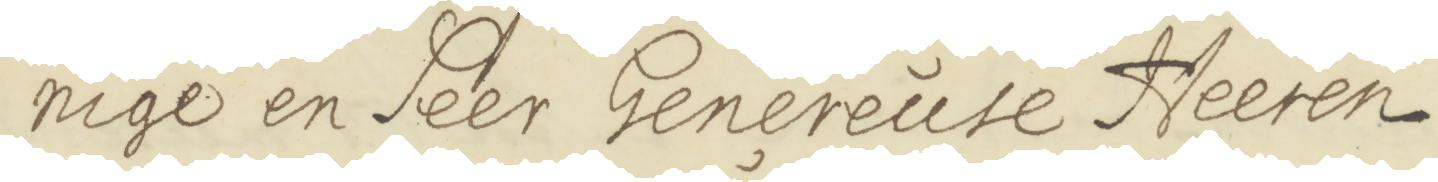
nige en seer Genereuse Heeren
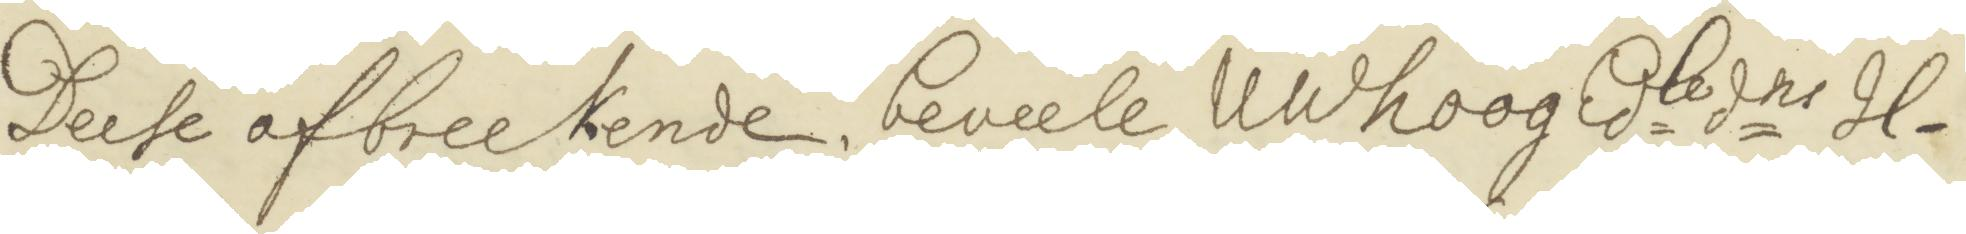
Deese afbreekende, beveele UW hoog Ed=le d=ns Il-
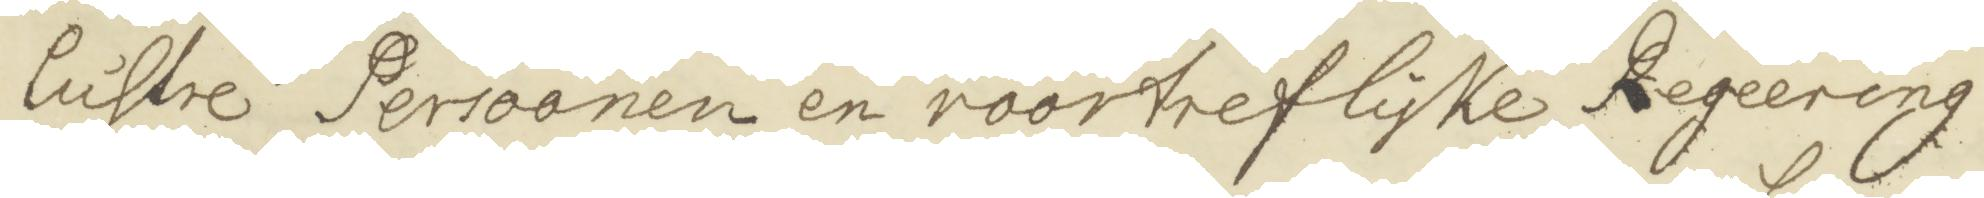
lustre Persoonen en voortreflijke Regeering
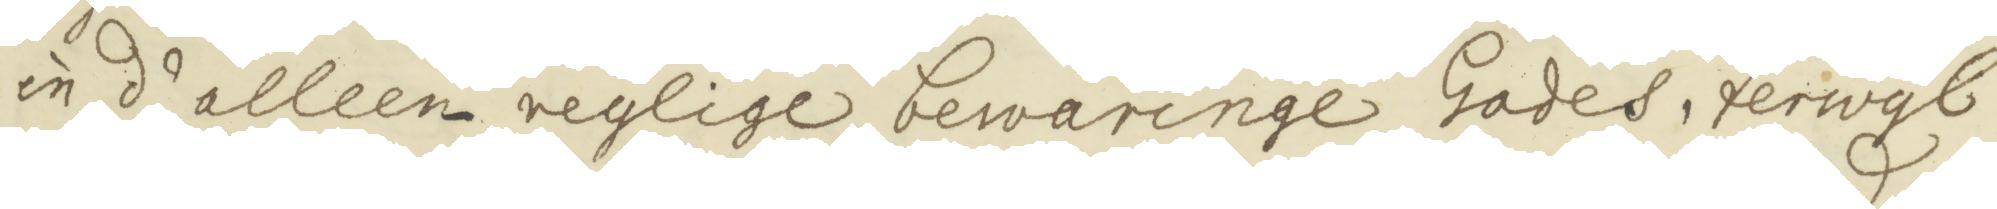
in d’ alleen veijlige bewaringe Godes, terwijl
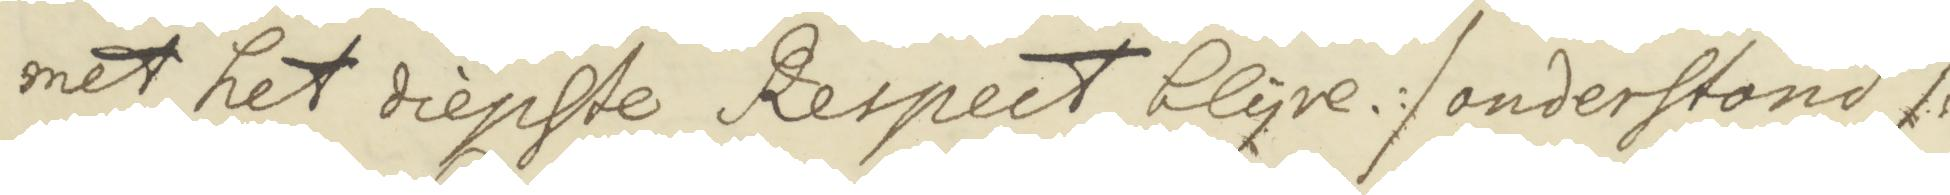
met het diepste Respect blijve. :/onderstond/:
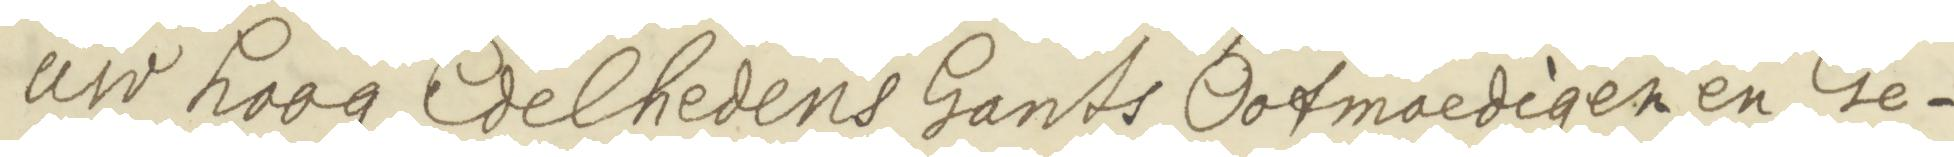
uw hoog Edelhedens Gants Ootmoedigen en Ge-
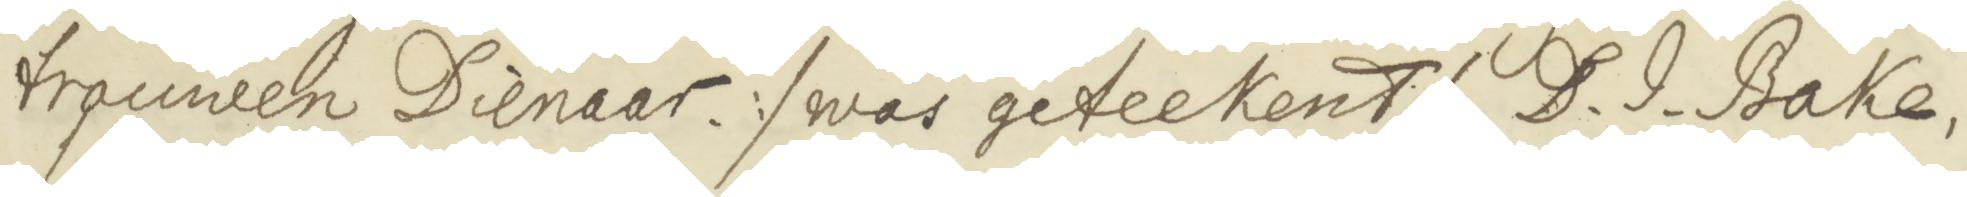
trouwen Dienaar. :/was geteekent/: D. I. Bake,
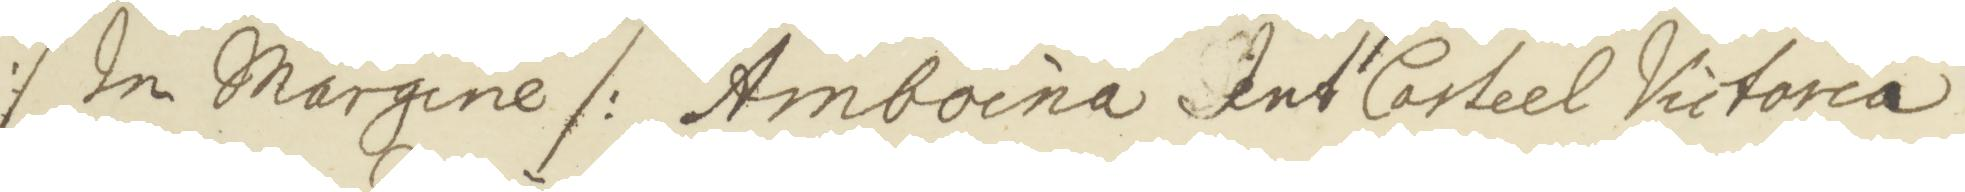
:/In Margine/: Amboina Int Casteel Victoria
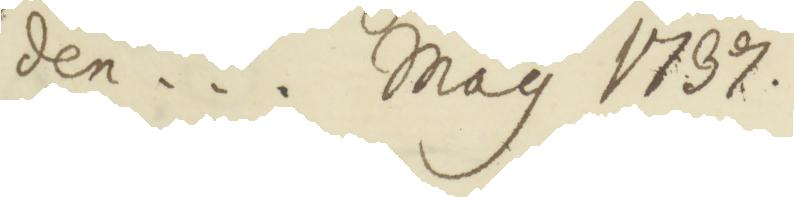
den ... Maij 1737.
